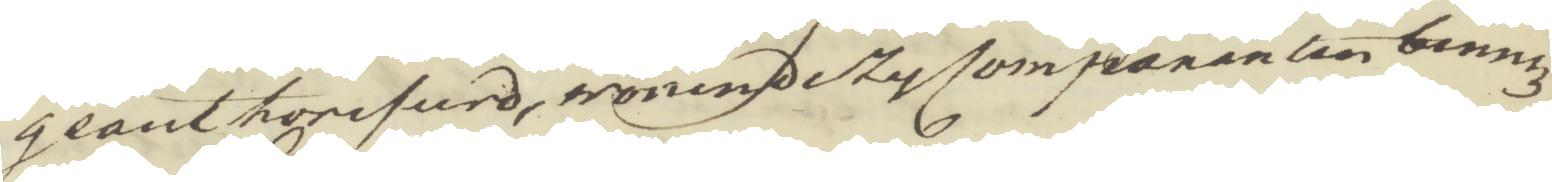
geauthoriseerd, wonende zy comparanten binnen
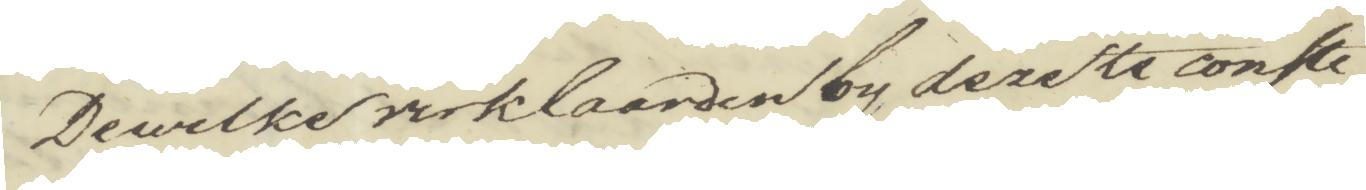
Dewelke verklaarden by deze te conste
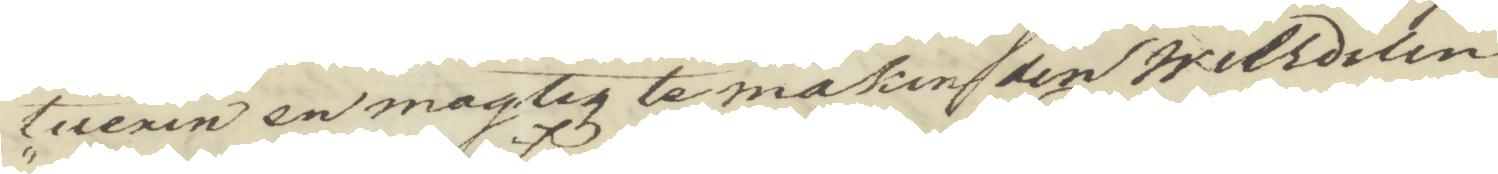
„tueren en magtig te maken den welEdelen
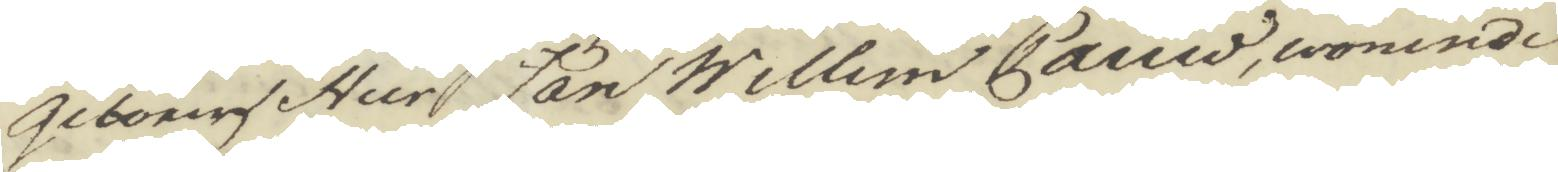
geboren Heer Jan Willem Pauw, wonende
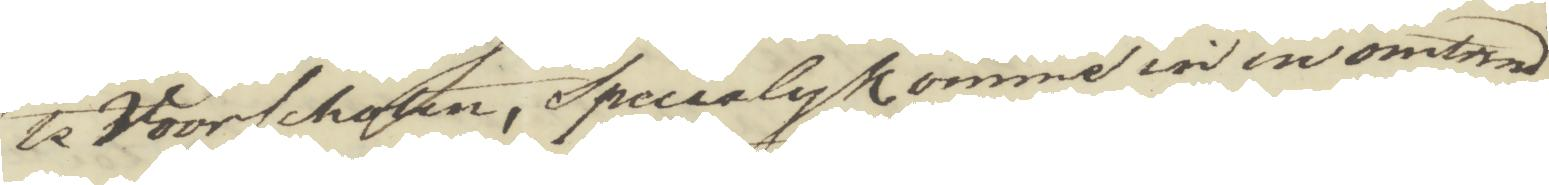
te Voorschoten, specialyk omme in en omtrend
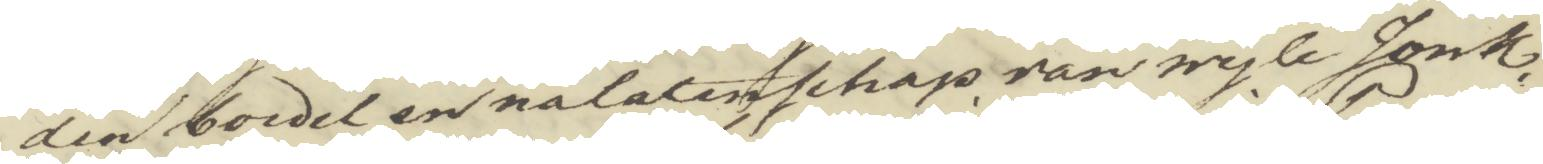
den boedel en nalatenschap van wyle Jonk,
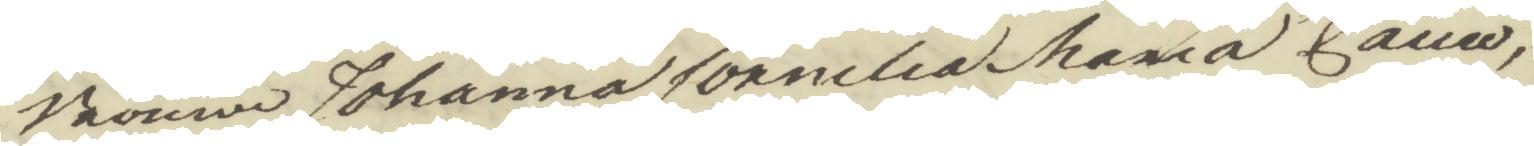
Vrouwe Johanna Cornelia Maria Pauw,
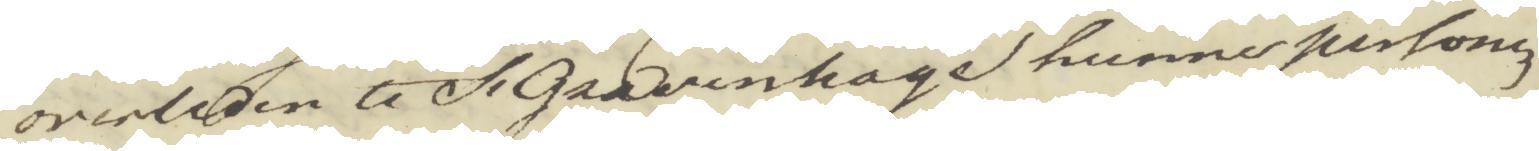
overleden te s'Gravenhage hunne personen
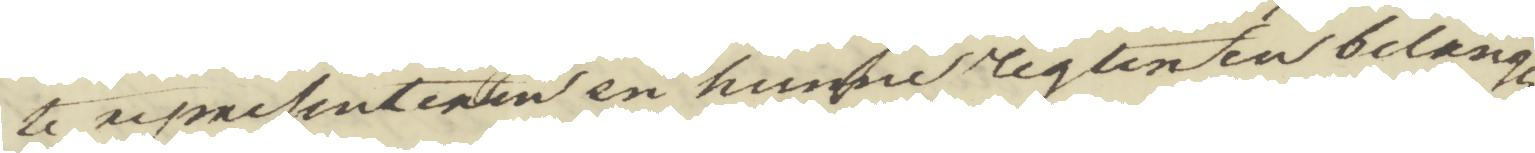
te representeren en hunne regten en belangen
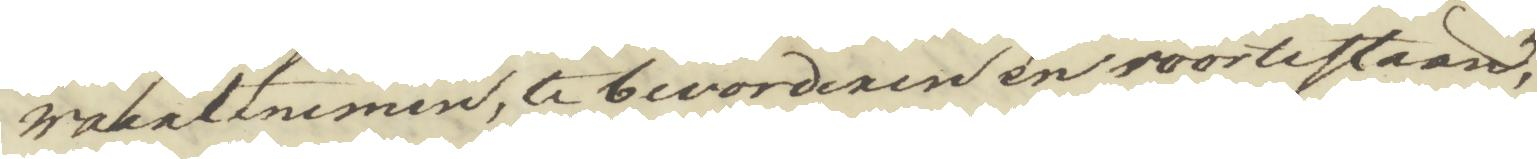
waar te nemen, te bevorderen en voor te staan,
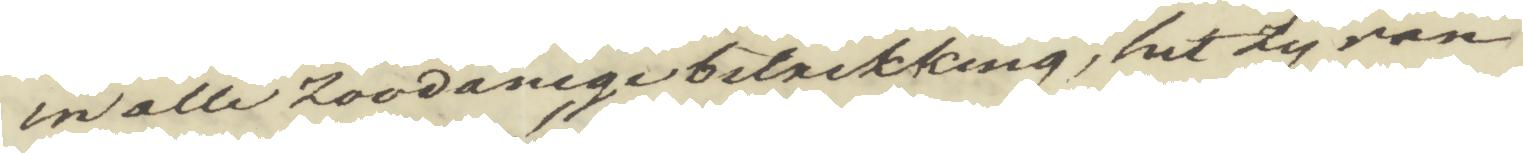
in alle zoodanige betrekking, het zy van
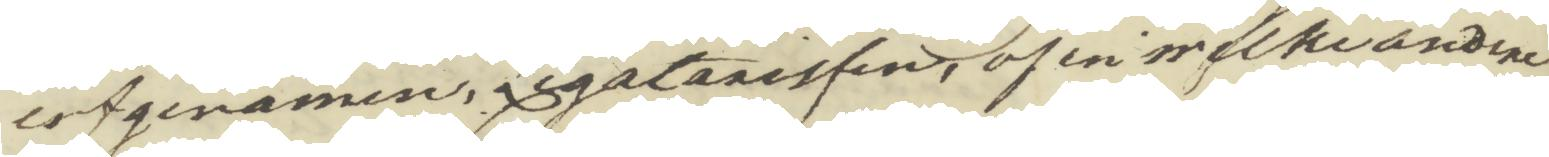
erfgenamen, Legatarissen, of en welke andere
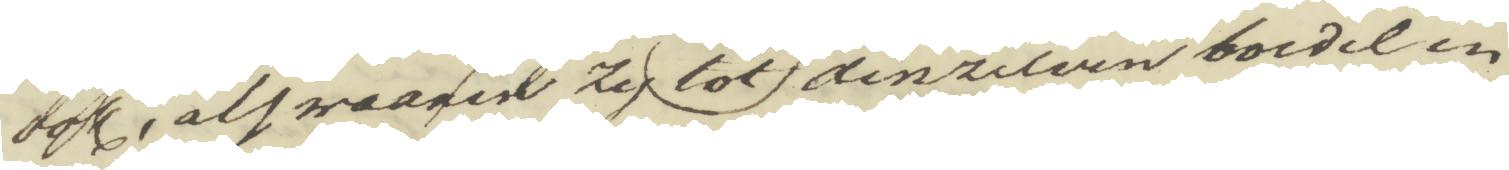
ook, als waaren zy tot, den zelven boedel en
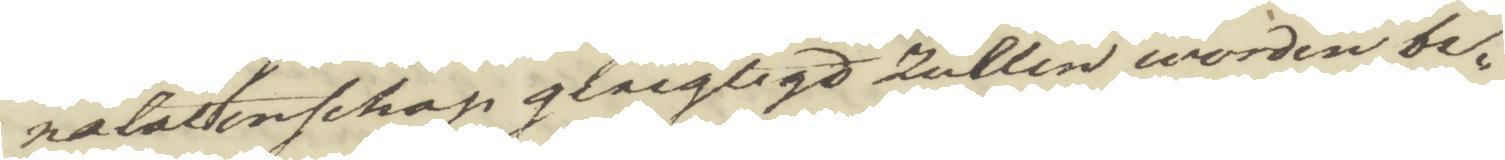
nalatenschap geregtigd zullen worden be„
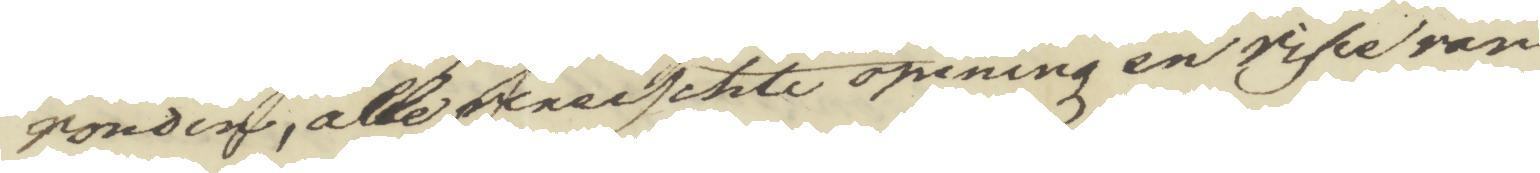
vonden, alle vereischte opening en visie van
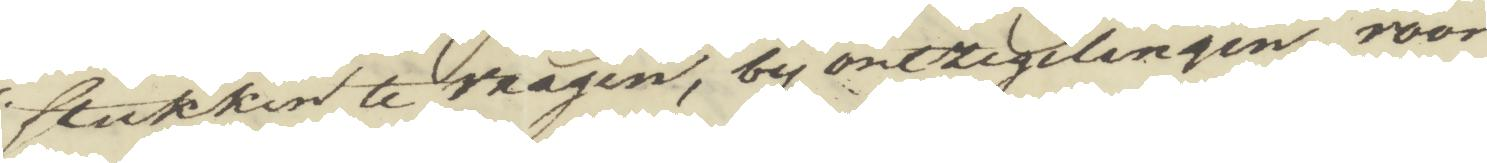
stukken te vragen, by ontzegelingen, voor
